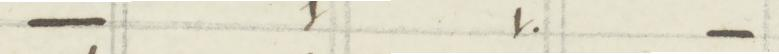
— 1 1. —
